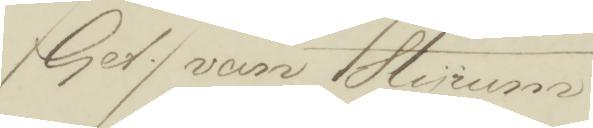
/Get:/ van Stijrum
